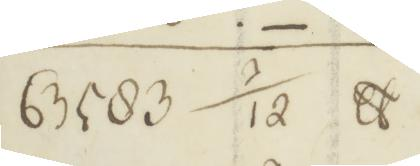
63583 7/12 lb
